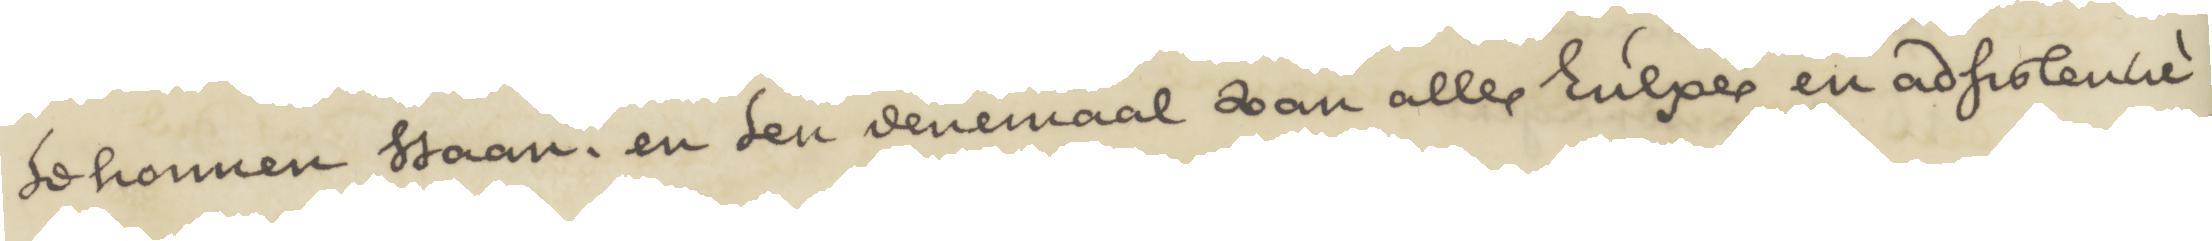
te konnen staan, en ten eenemaal van alle hulpe en adsistentie
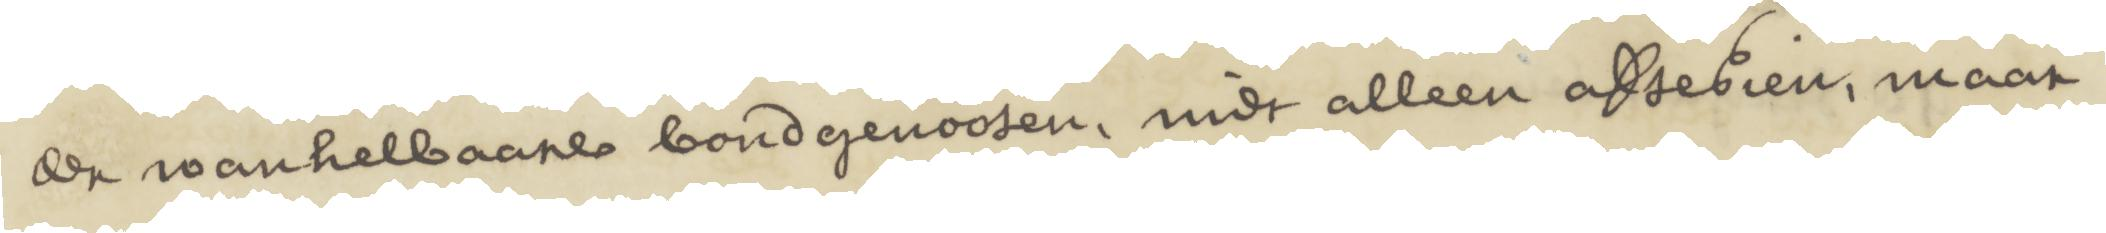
der wankelbaare bondgenooten, niet alleen aftesien, maar
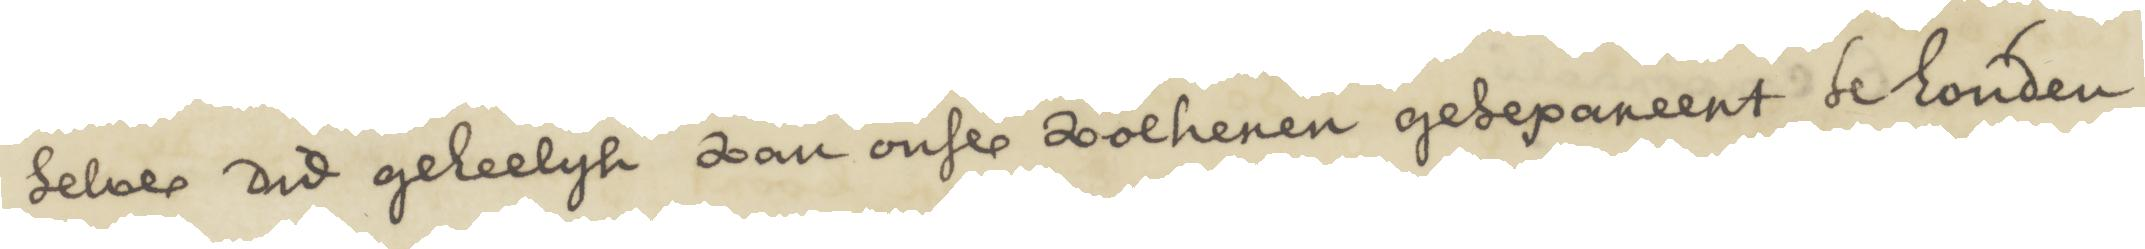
selve die geheelijk van onse volkeren gesepareert te houden
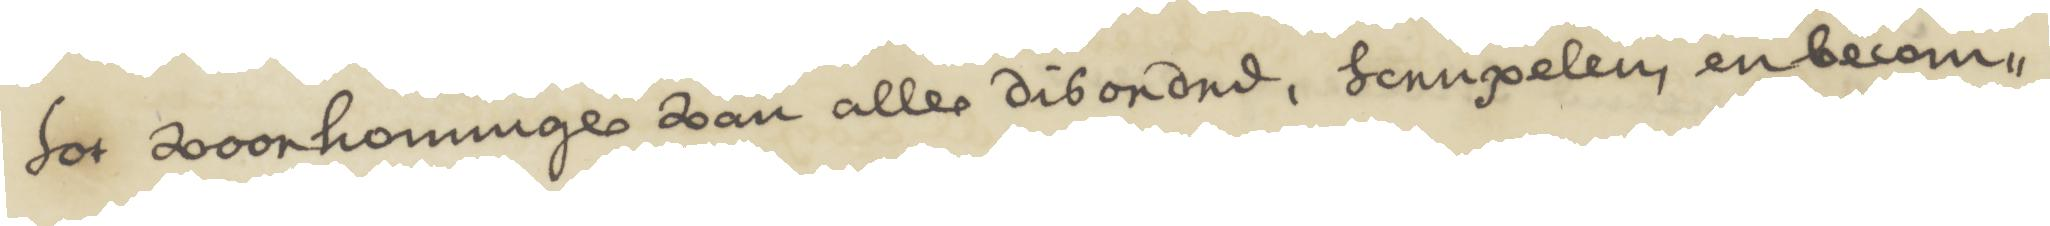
tot voorkominge van alle disordre, scrupelen, en becom„
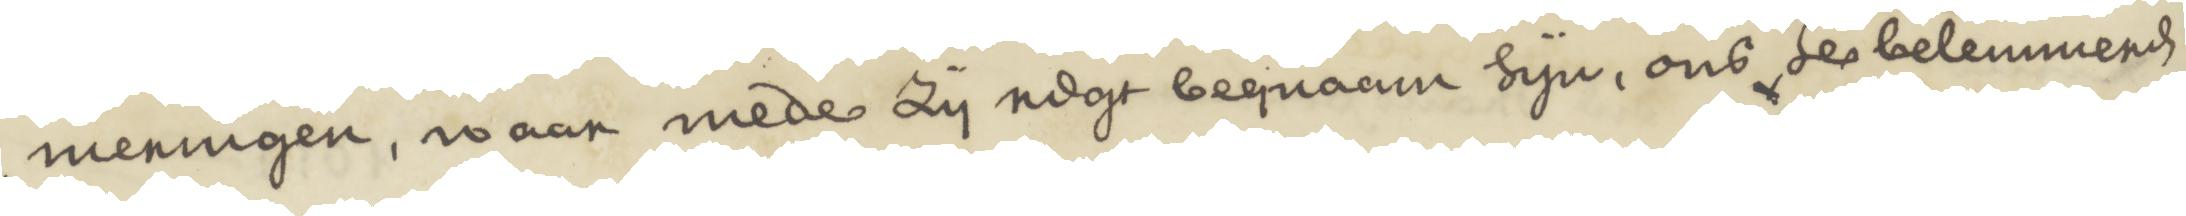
meringen, waar mede zij regt bequaam sijn, ons ^ te belemmeren
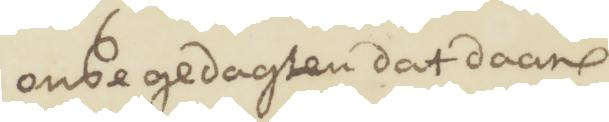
onse gedagten dat daar
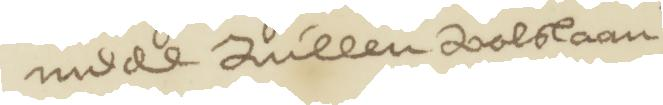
mede zullen volstaan
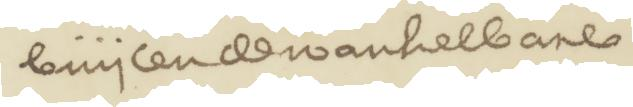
buijten de wankelbare
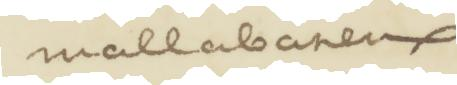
mallabaren
